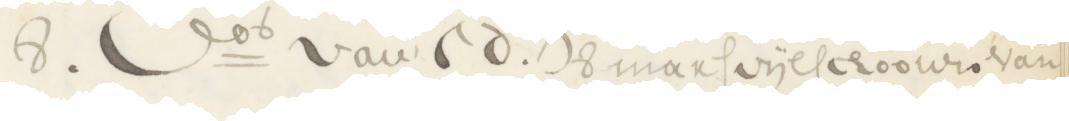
8. D=os van 5 d. 8 marseijlschooten van
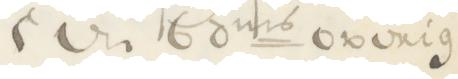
5 en 6 d=ms overig
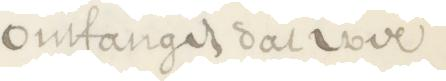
ontfange dat wel
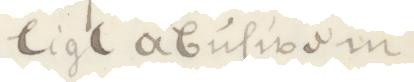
ligt abusive in
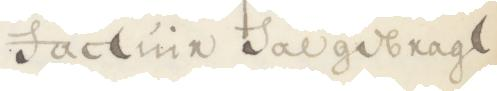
factuir sal gebragt
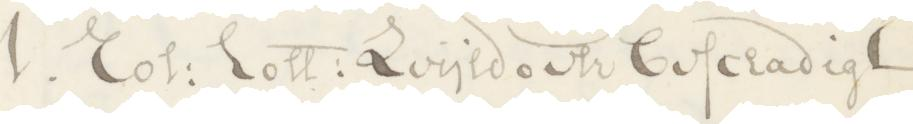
1. rol: holl: zeijldoek beschadigt
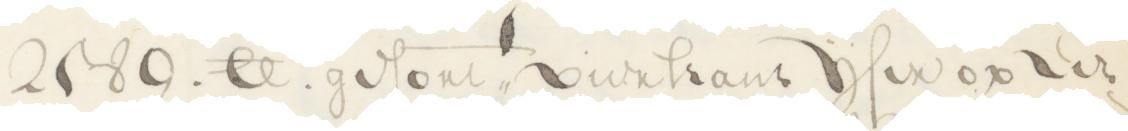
2589. lb. gesort„t vierkant ijser op een
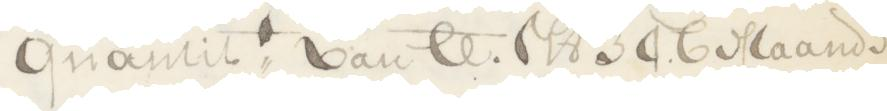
quantit„t van lb. 51834. bestaande
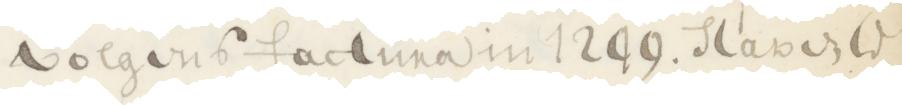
volgens factura in 1249. staven te
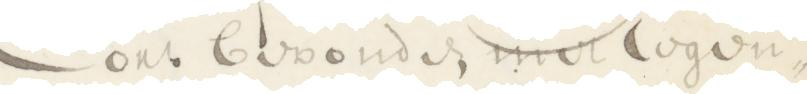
Cort bevonden niet legen„
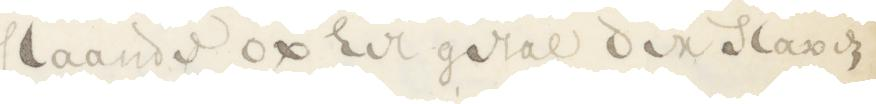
staande oph het getal der slaven
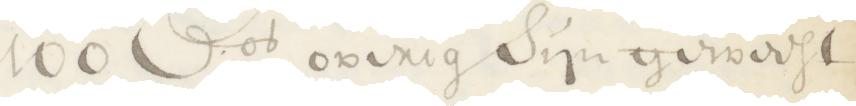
100 D=os overig sijn geweest
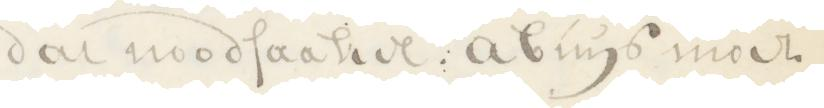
dat noodsaakel:n abuijs moet
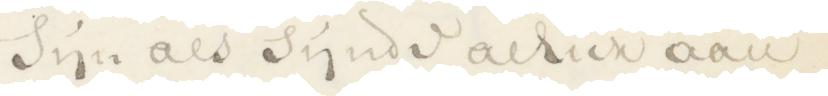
sijn als sijnde alhier aan
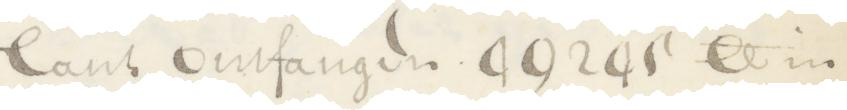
lant ontfangen 49245 lb in
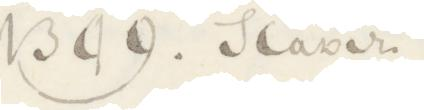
1349. staven
